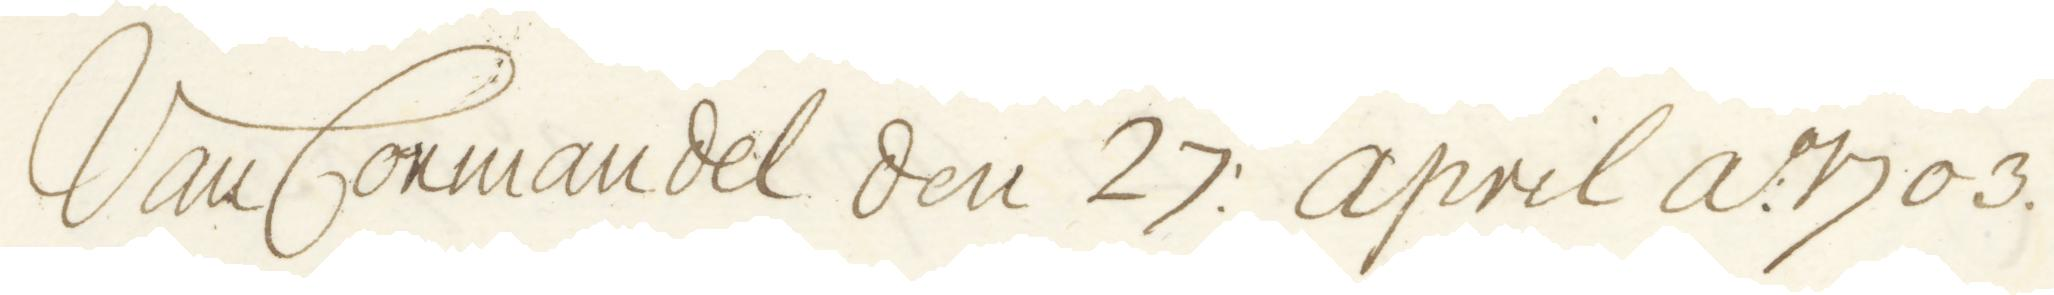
Van Cormandel den 27: april a:o 1703.
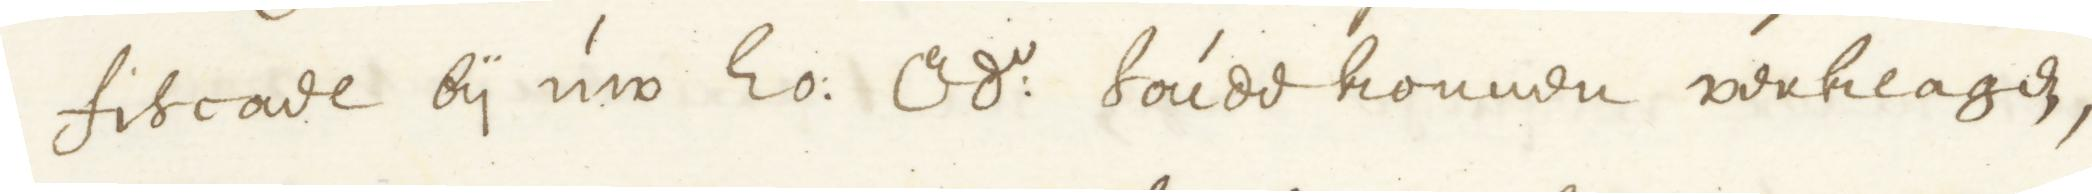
fiscael bij uw ho: Ed:e soude konnen verklagen,
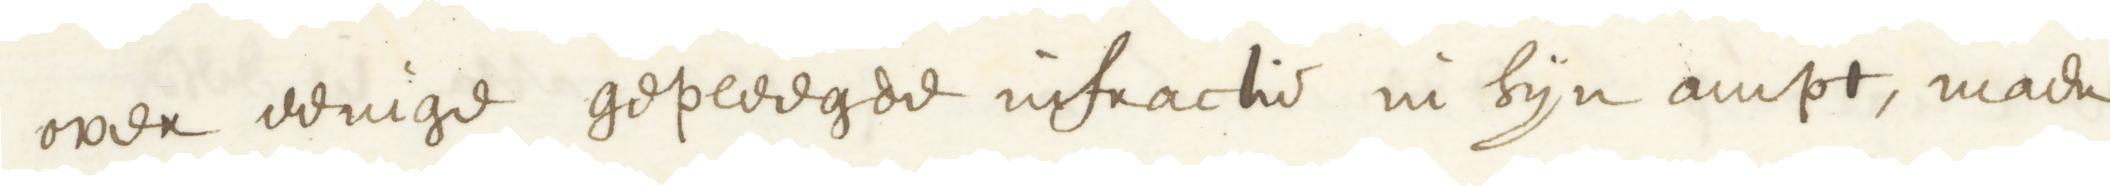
over eenige gepleegde infractie in sijn ampt, maer
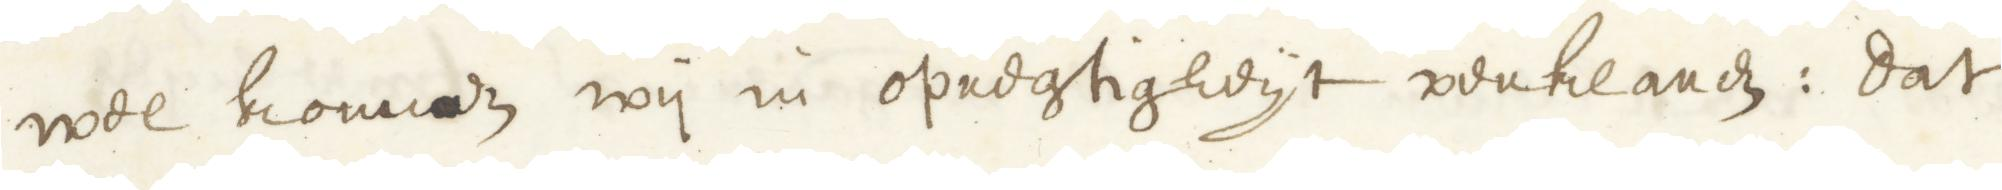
wel konnen wij in opregtigheijt verklaren: dat
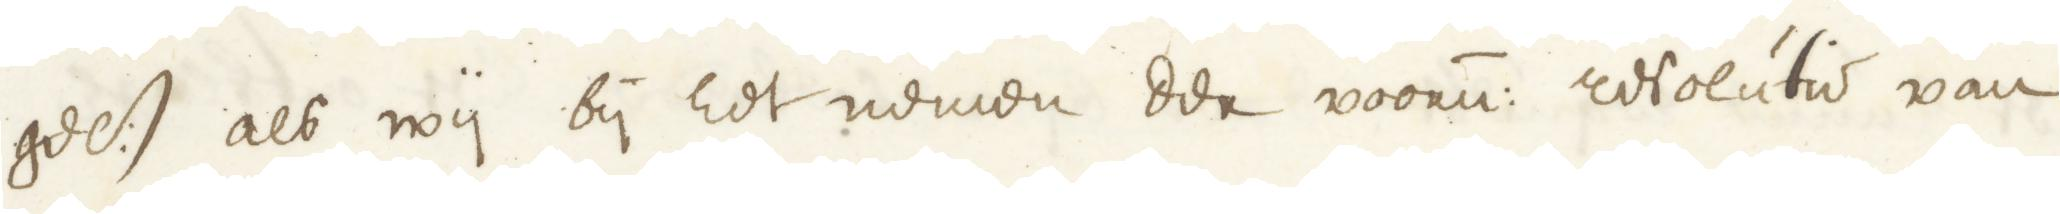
gelijk als wij bij het nemen der voorn: resolutie van
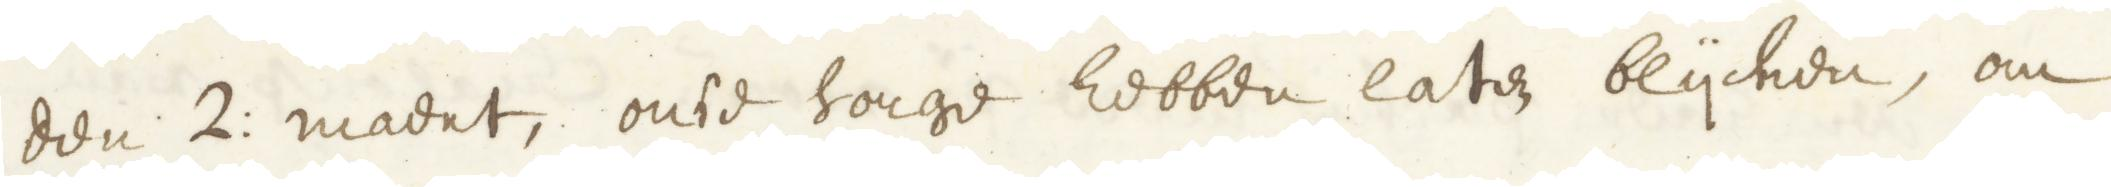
den 2: maert, onse sorge hebben laten blijcken, om
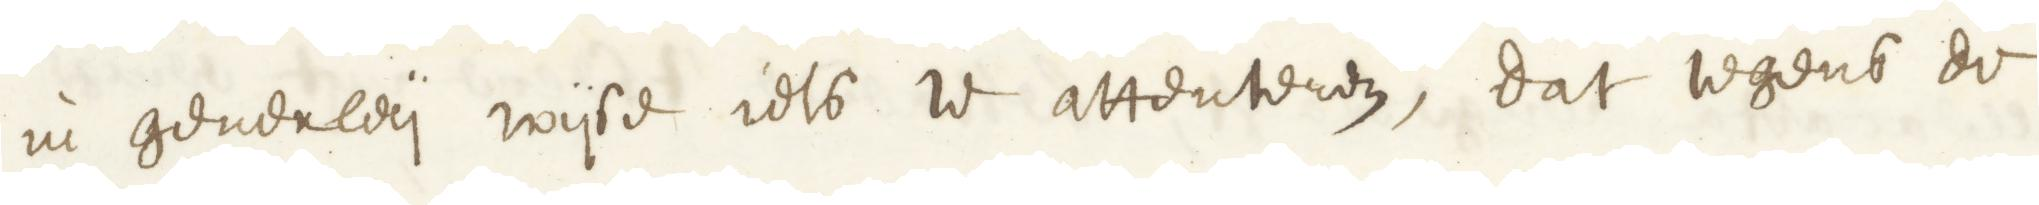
in generleij wijse iets te attenteren, dat tegens de
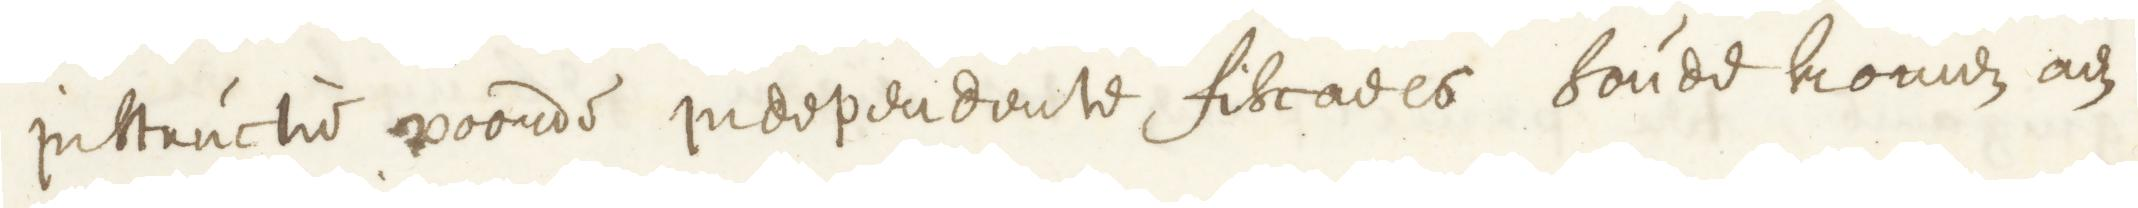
instructie voorde jndependente fiscaels soude komen aen
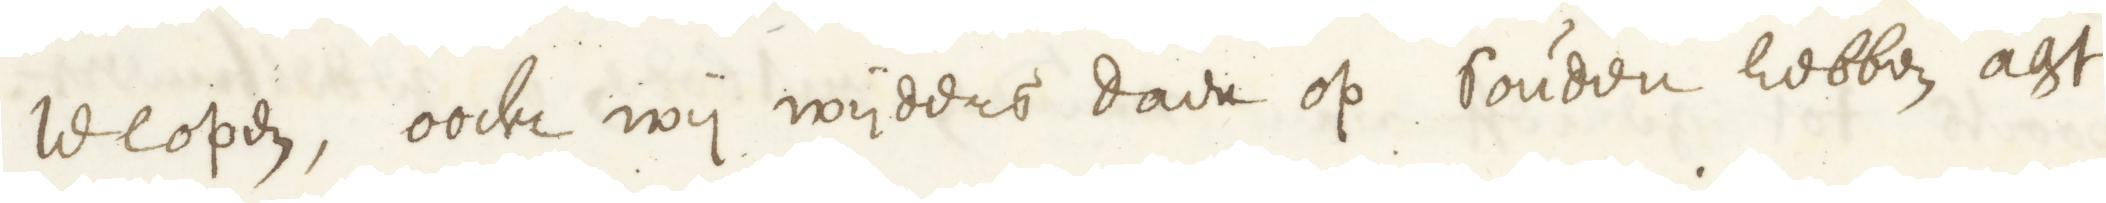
te lopen, oock wij wijders daer op souden hebben agt
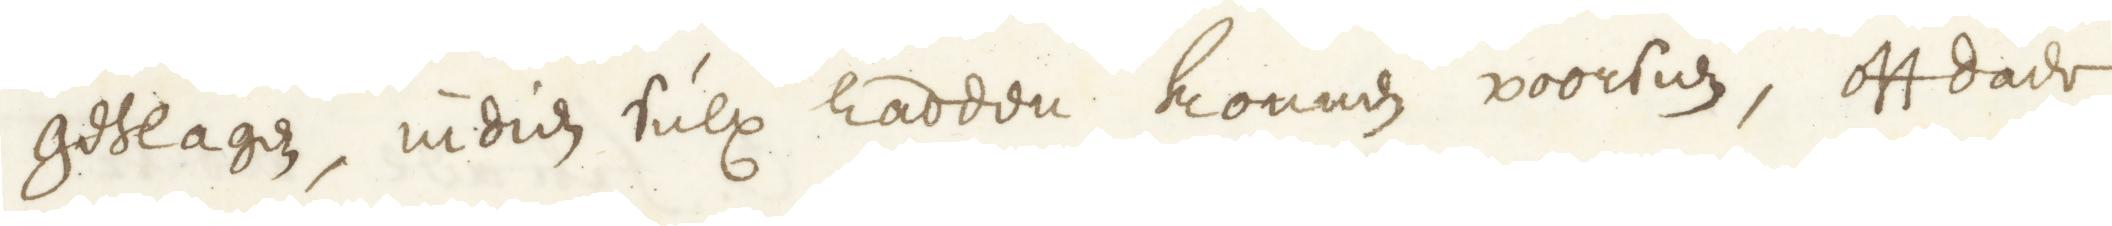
geslagen, in dien sulx hadden konnen voorsien, off daer
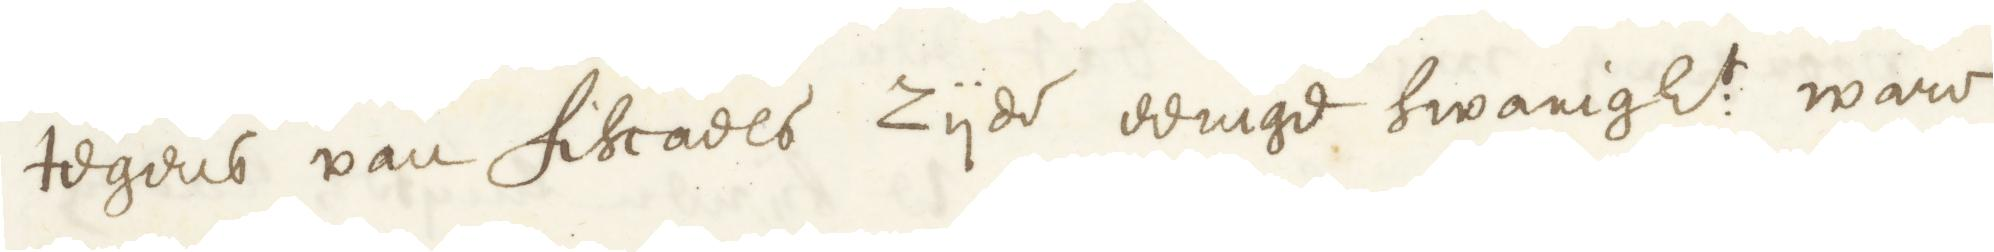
tegens van fiscaels zijde eenige swarigh:t ware
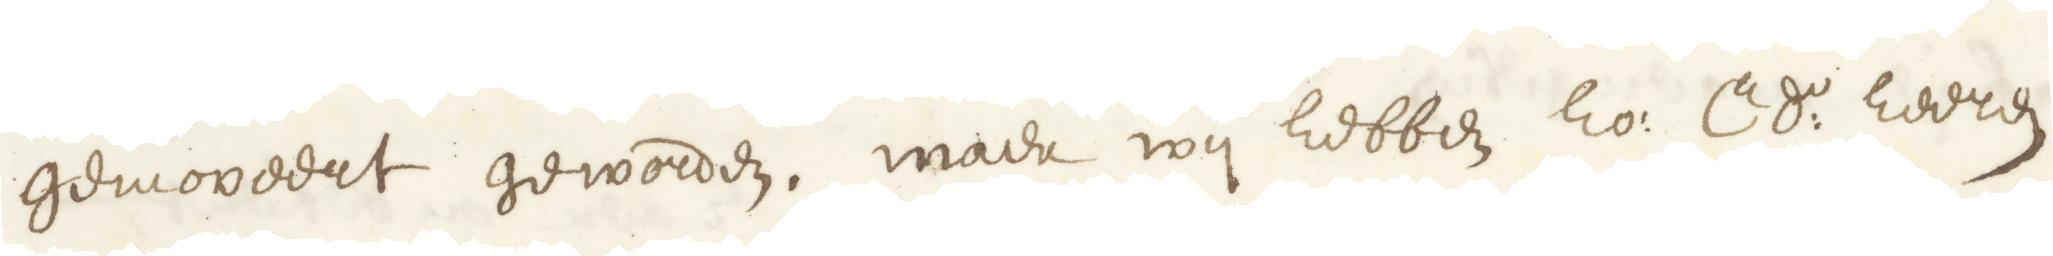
gemoveert geworden, maer wij hebben ho: Ed:e heeren
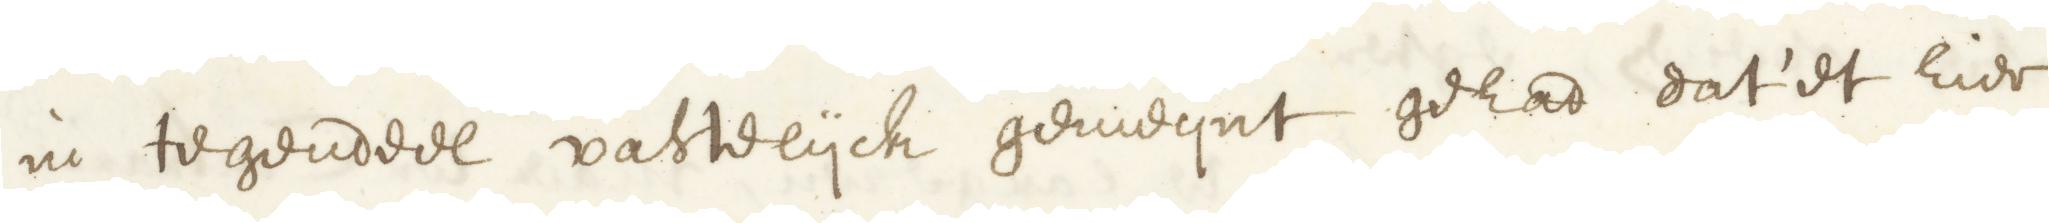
in tegendeel vastelijck gemeijnt gehad dat 'et hier
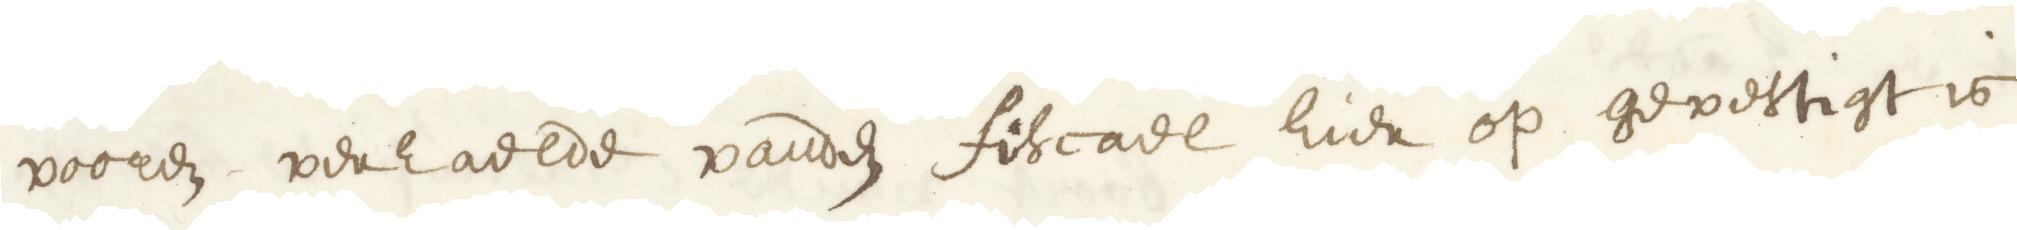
vooren verhaelde vanden fiscael hier op gevestigt is
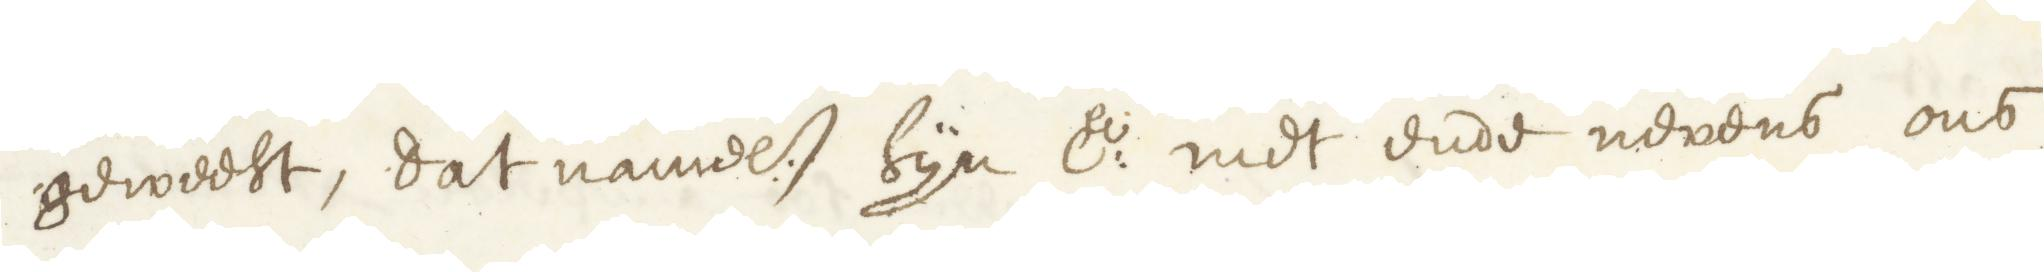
geweest, dat namelijk sijn E: met ende nevens ons
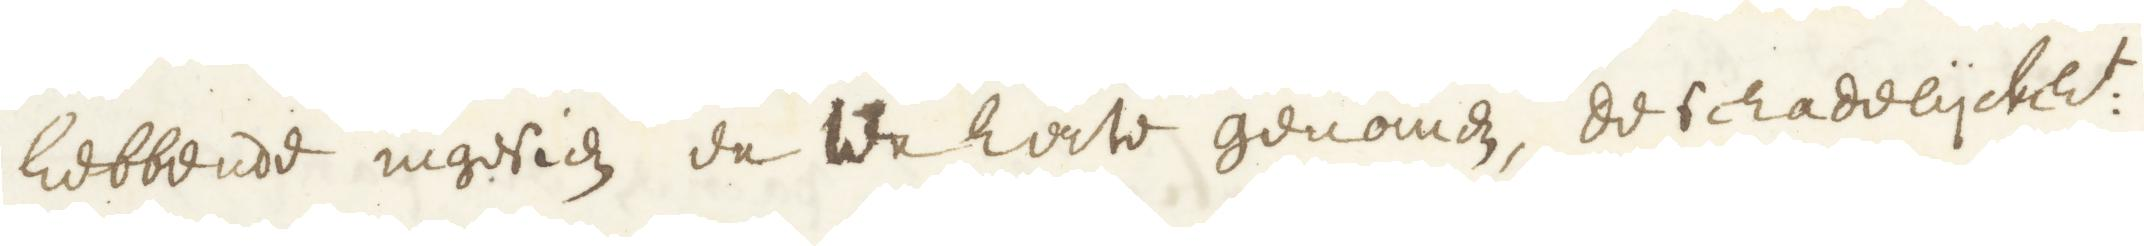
hebbende ingesien en ter herte genomen, de schadelijckh:t
